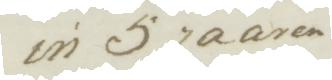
in 5 jaaren
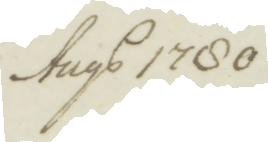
Augs 1780
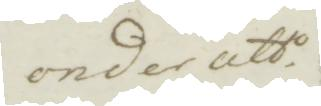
onder ult,o
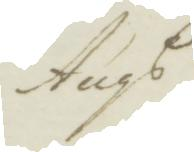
Augs
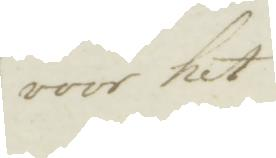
voor het
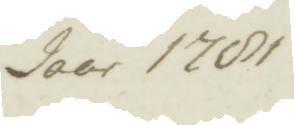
Iaar 1781
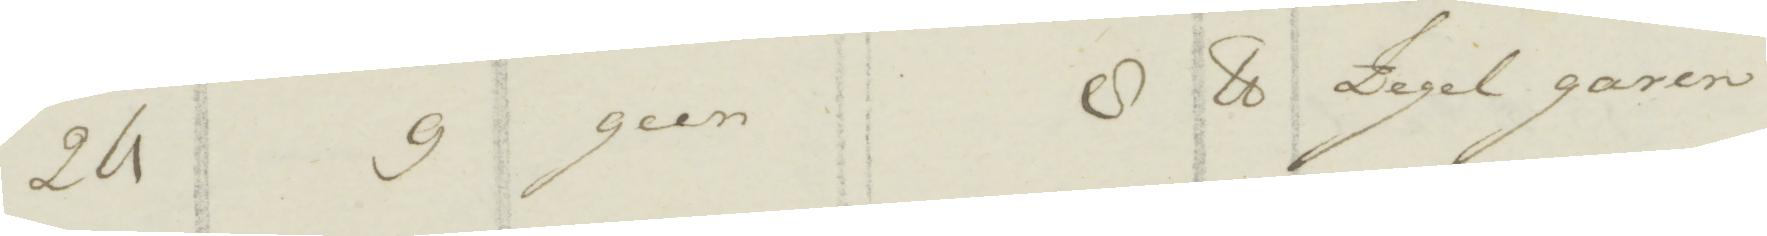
24 9 geen 8 lb zegel garen
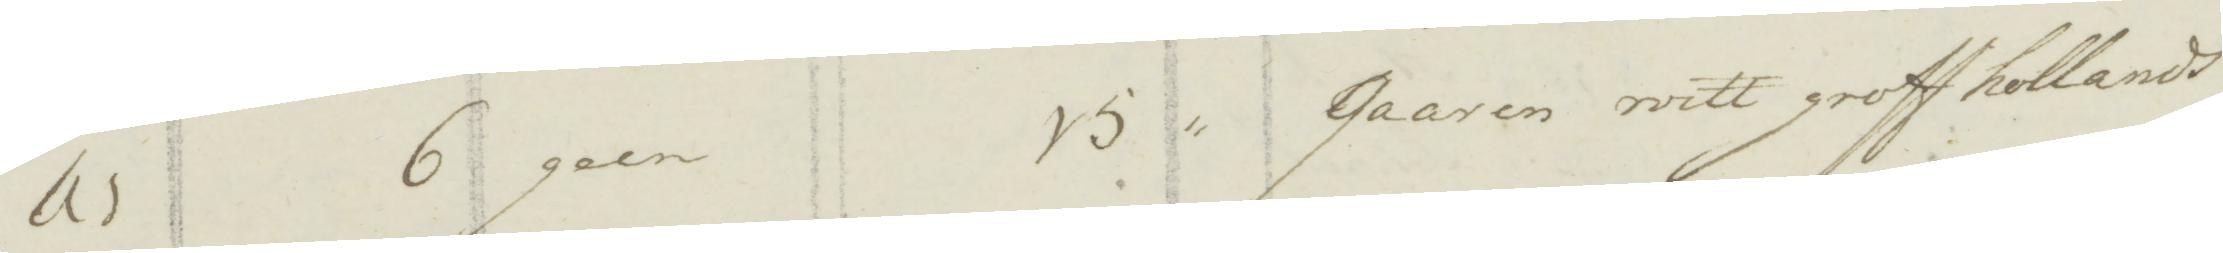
41 6 geen 15 „ gaaren witt groff hollands
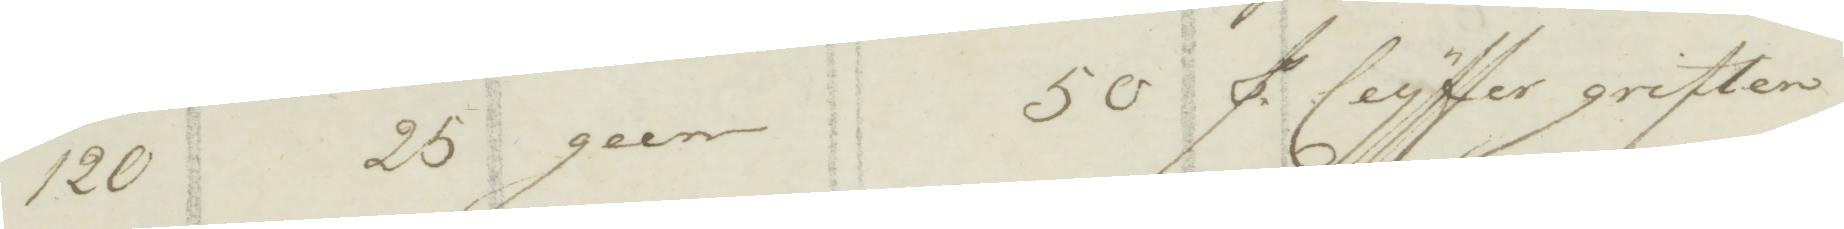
120 25 geen 50 p.s Ceijffer griften
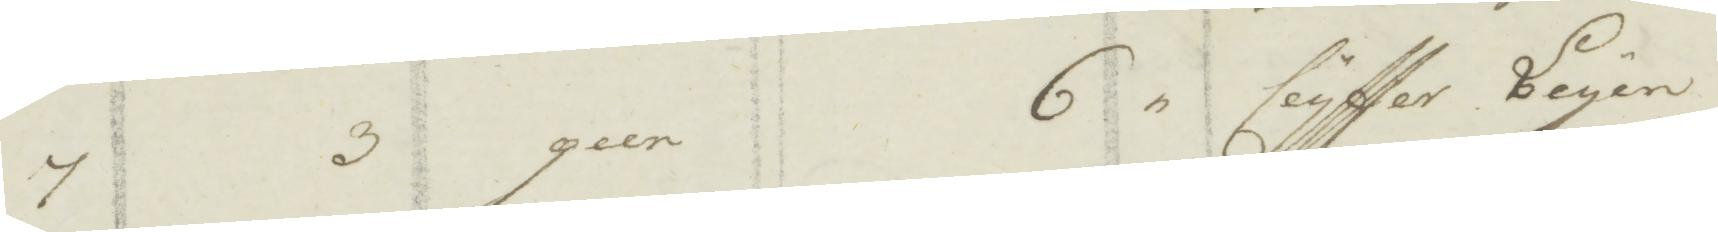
7 3 geen 6 „ Ceijffer Leijen
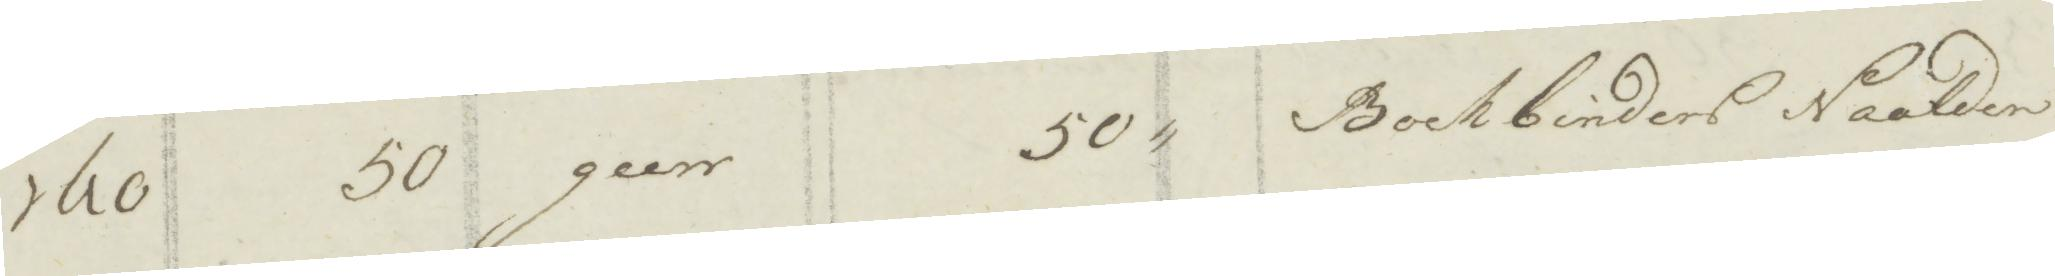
140 50 geen 50 „ Boekbinders Naalden
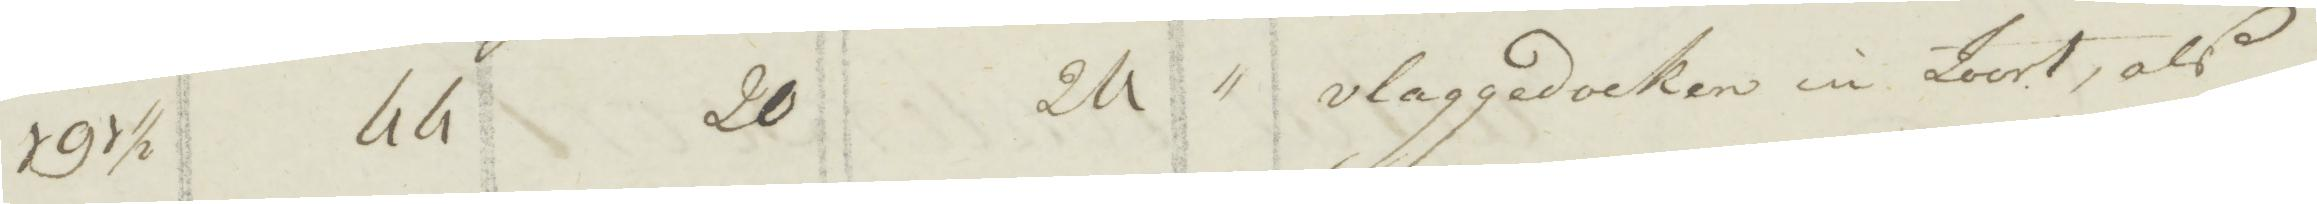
191½ 44 20 24 „ vlaggedoeken in zoort, als
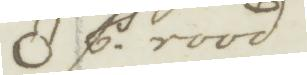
8 p„s rood
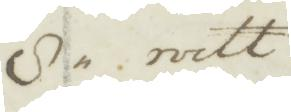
8 „ witt
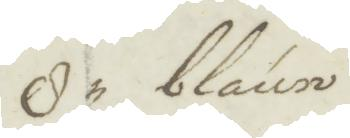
8„ blauw
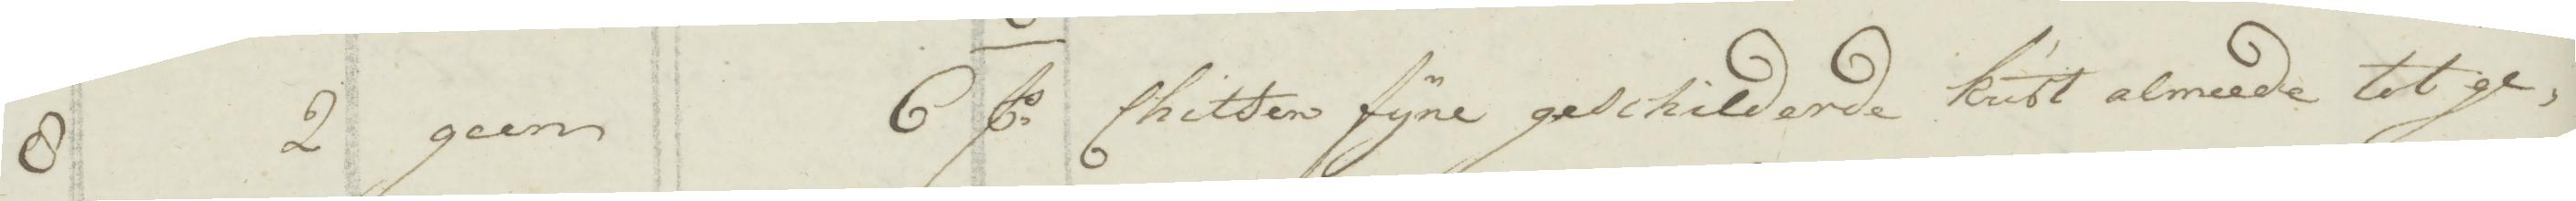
8 2 geen 6 p.s Chitsen fijne geschilderde kust almeede tot ge„
